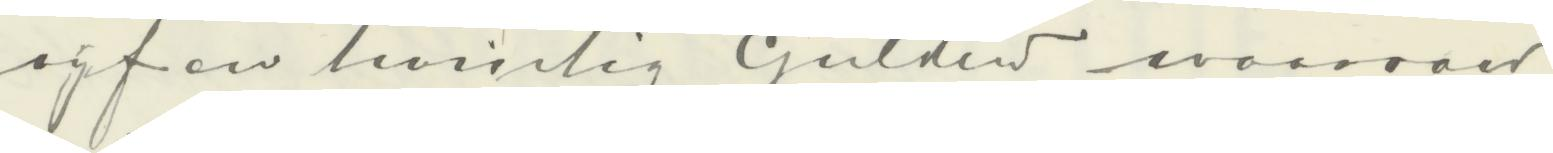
vijf en twintig Gulden, waarvan
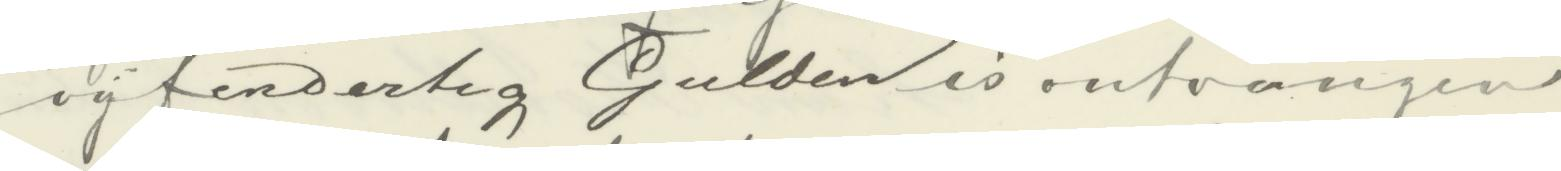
vijfendertig Gulden is ontvangen
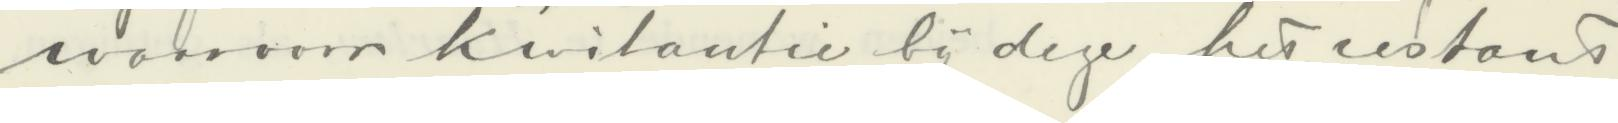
waarvoor kwitantie bij deze, het restant
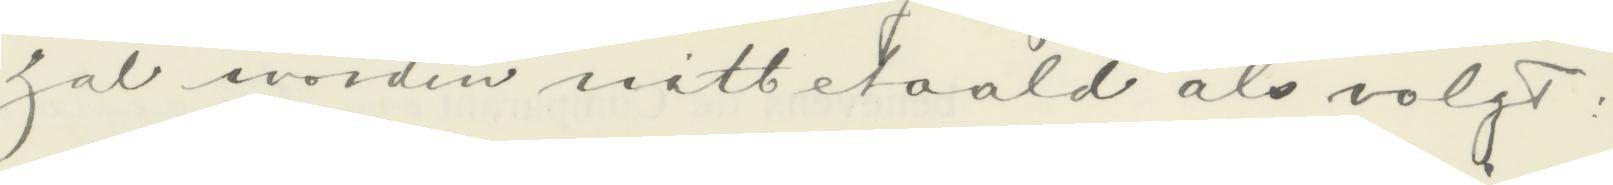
zal worden uitbetaald als volgt:
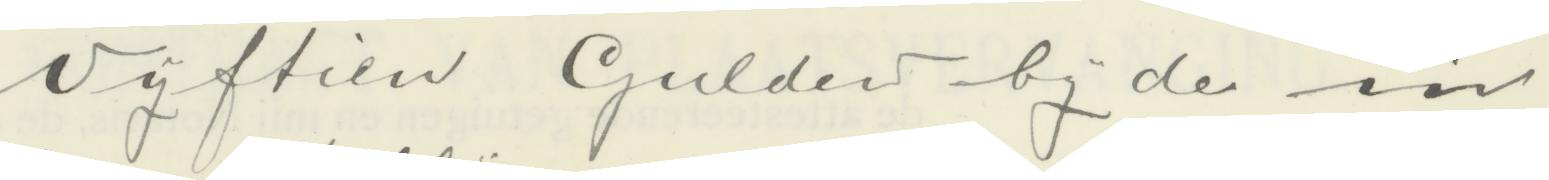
Vijftien Gulden bij de in
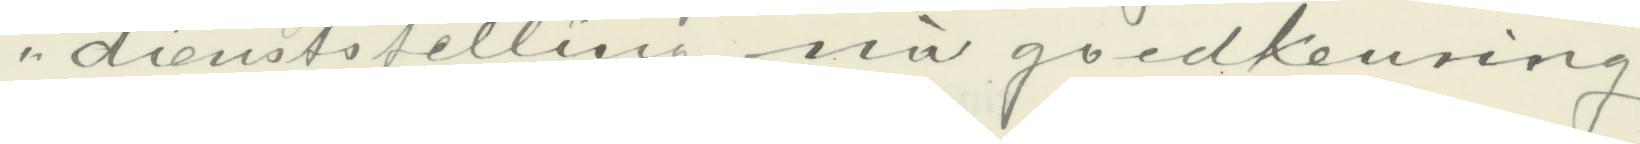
„dienststelling nà goedkeuring
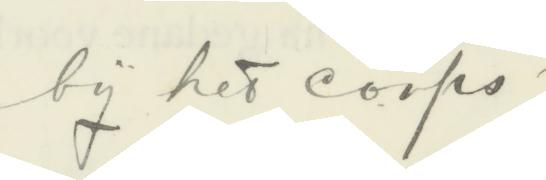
bij het corps
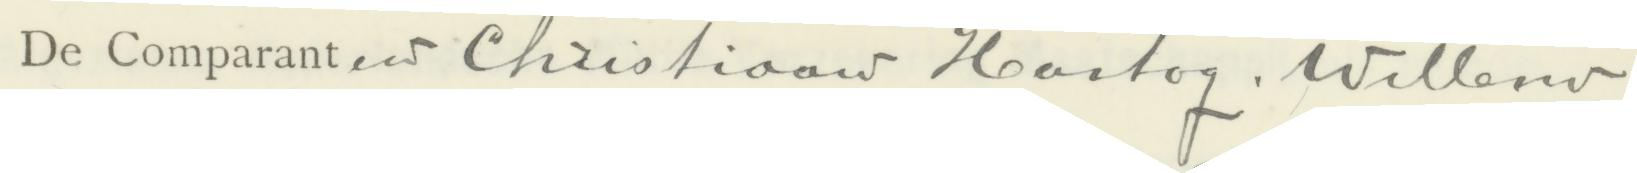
en Christiaan Hartog, Willem
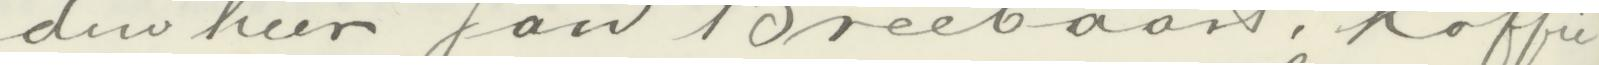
den Heer Jan Breebaart, Koffie
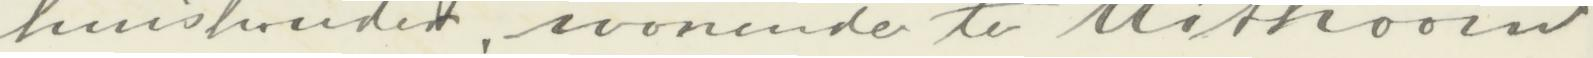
huishouder, wonende te Uithoorn
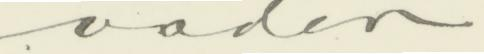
vader
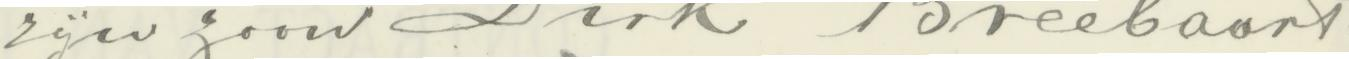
zijn zoon Dirk Breebaart
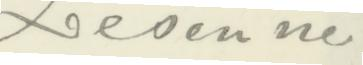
zes en ne
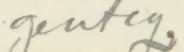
gentig
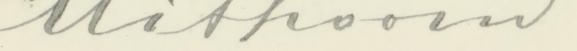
Uithoorn
